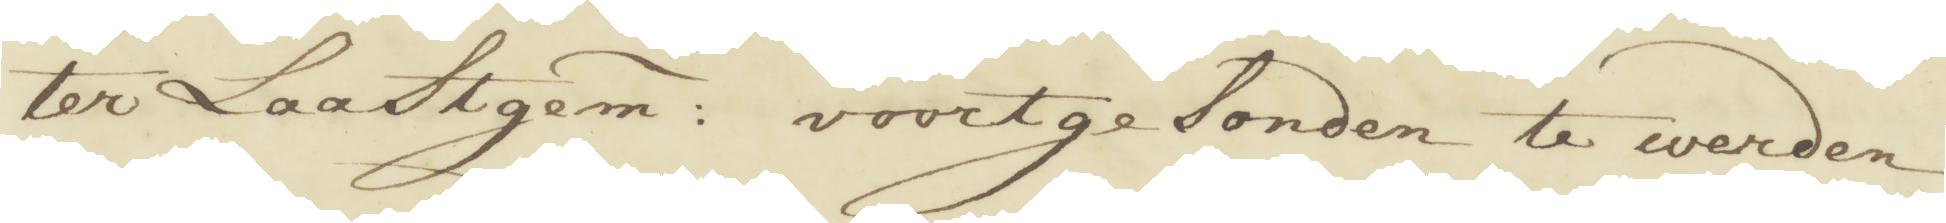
ter Laastgem: voortgesonden te werden
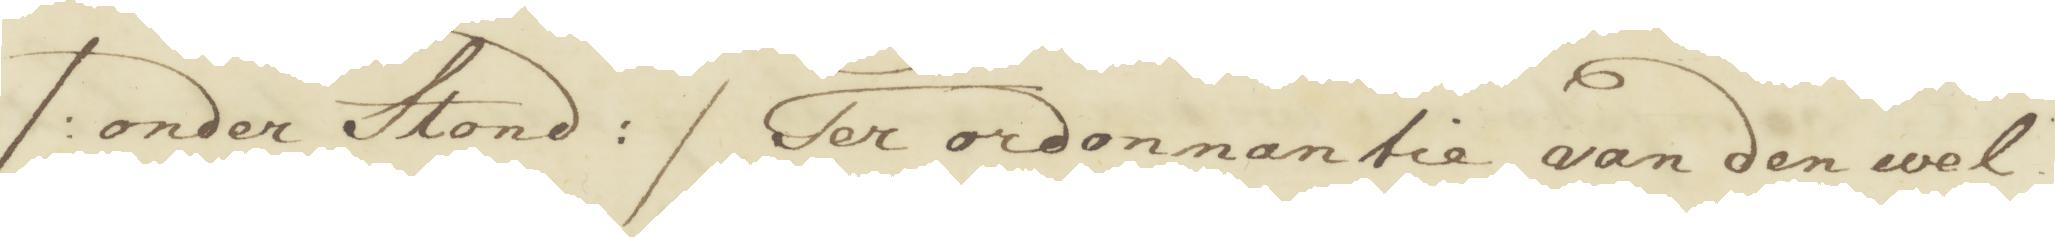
/: onder stond :/ Ter ordonnantie van den wel
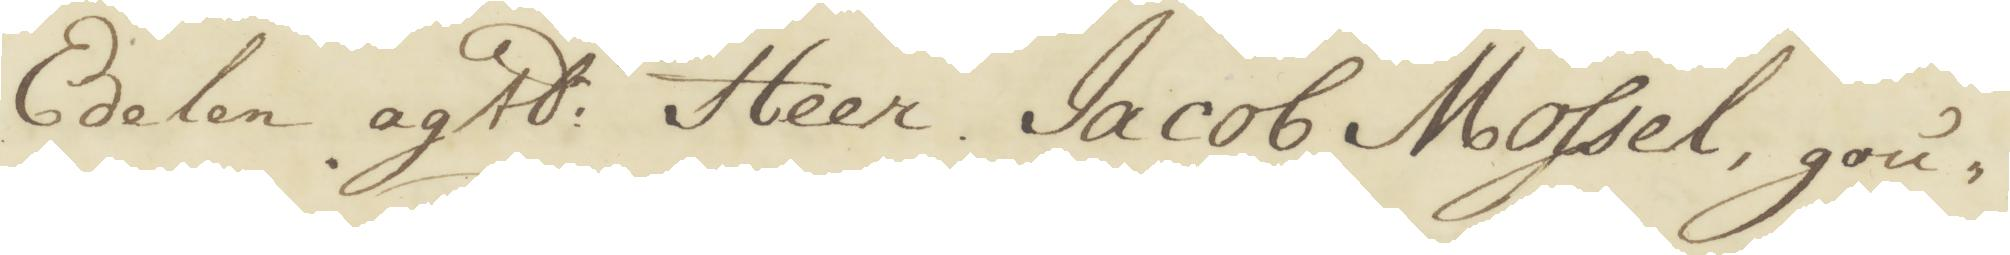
Edelen agtb: Heer Jacob Mossel, gou„
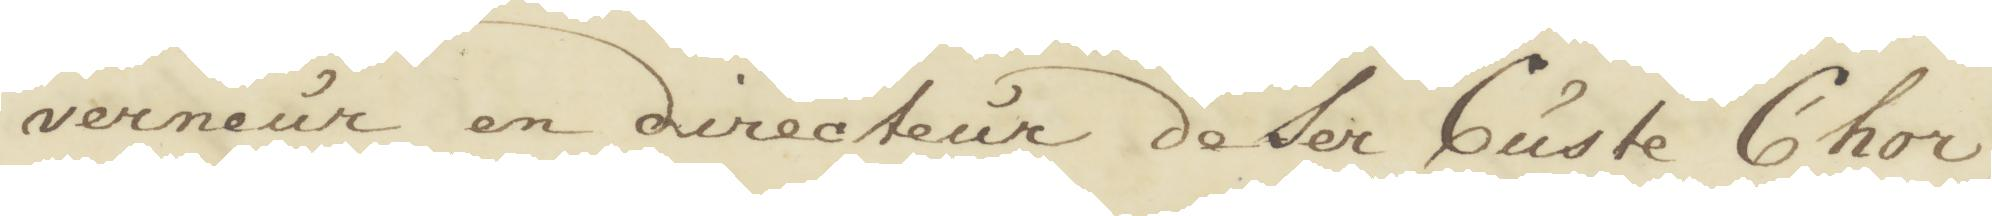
verneur en directeur deser Custe Chor
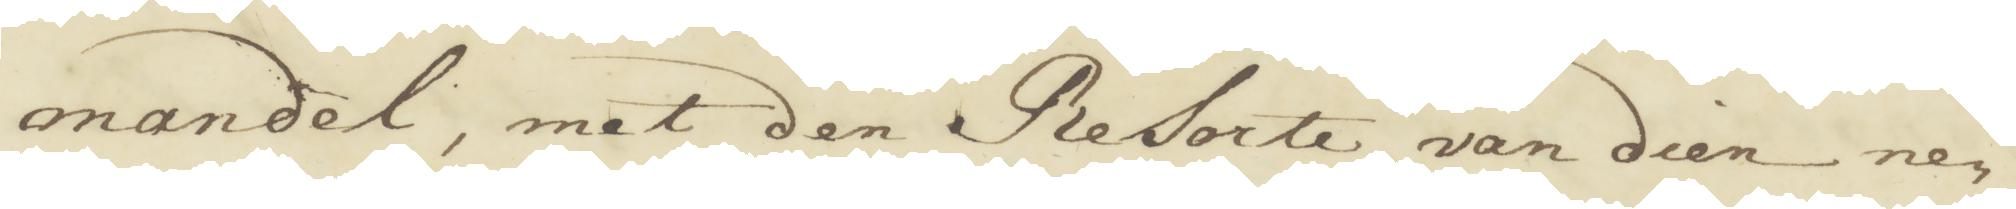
mandel, met den Resorte van dien ne
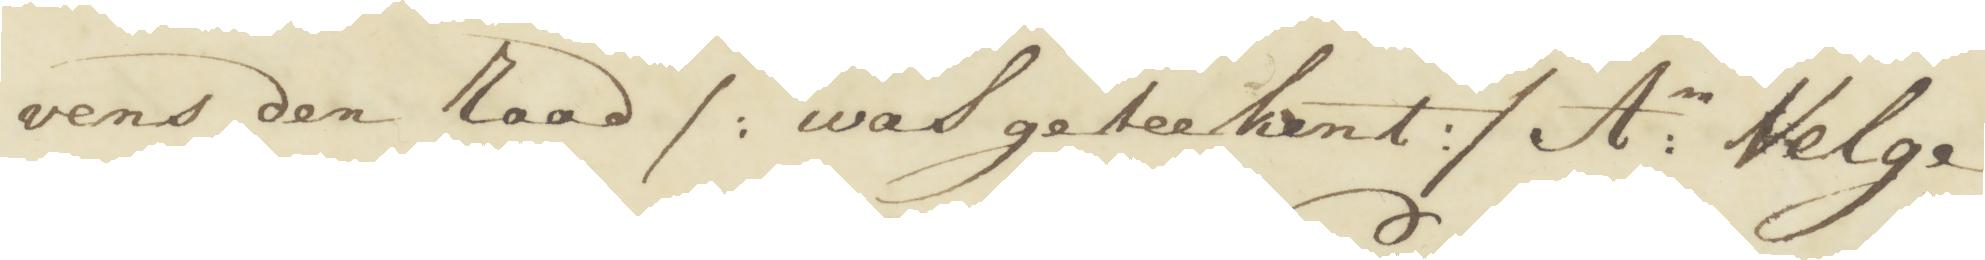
vens den Raad /: was geteekent:/ A:n Velge
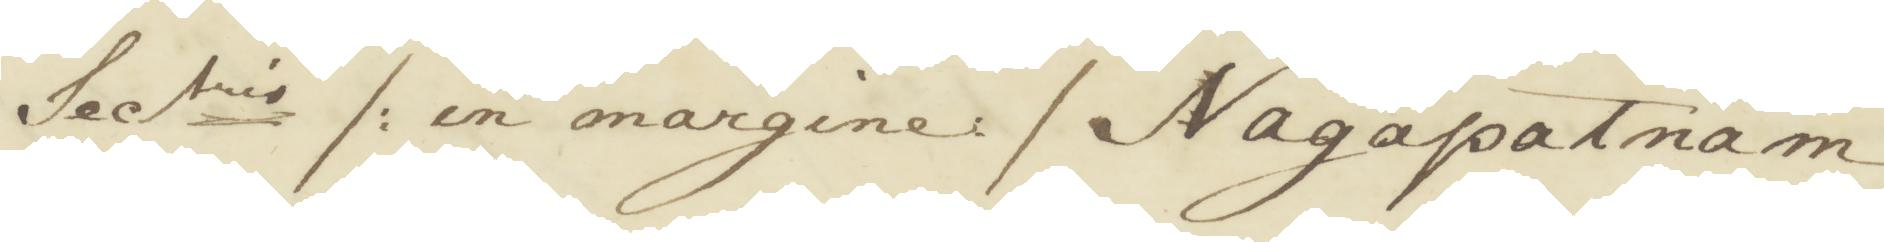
sec=tris /: in margine:/ Nagapatnam
